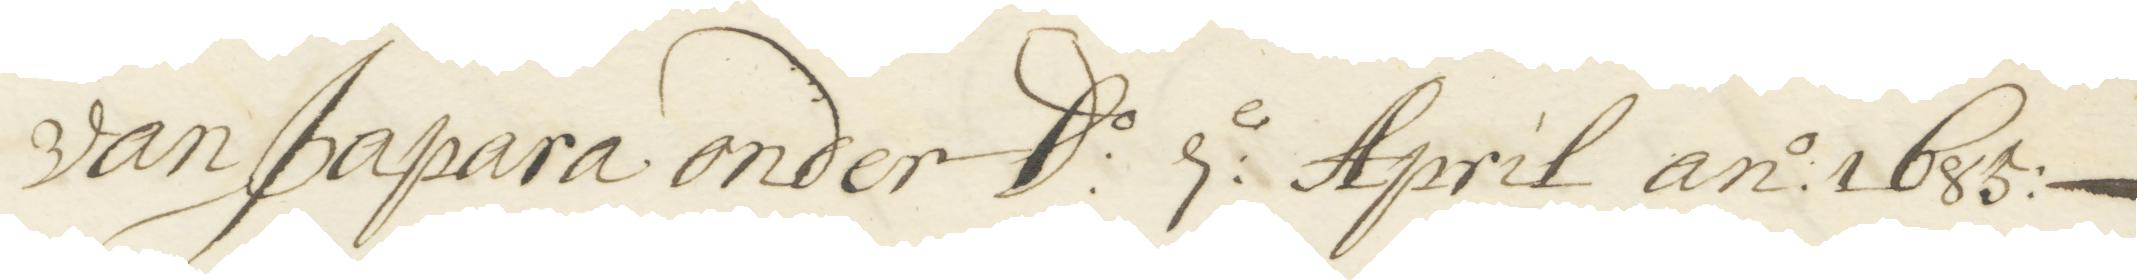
van Japara onder D:o 7:e April an:o 1685:
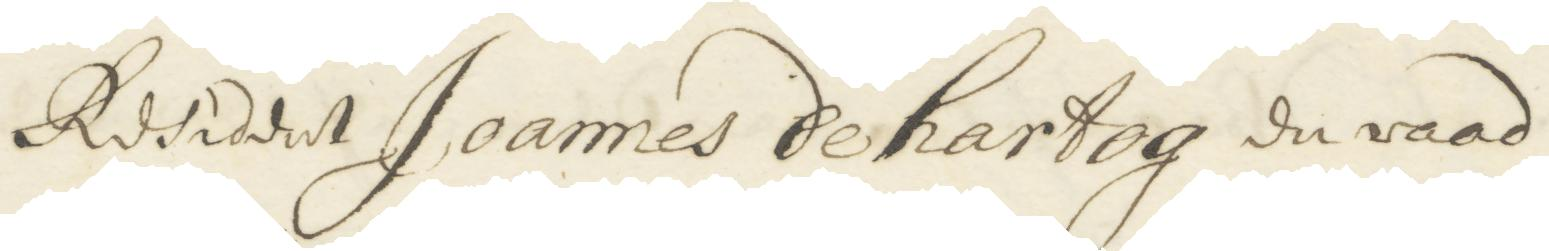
Resident Joannes de hartog en raad
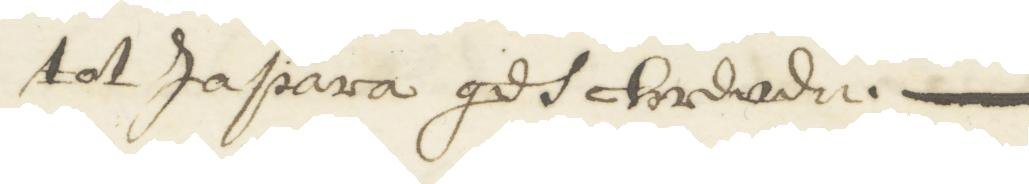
tot Japara geschreven.
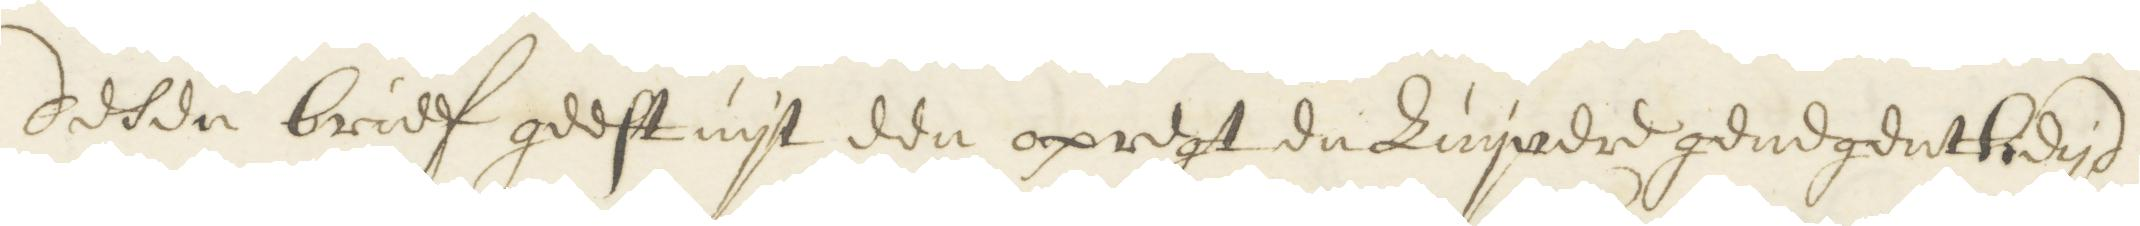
desen brief geeft uijt een opregt en zuijvere genegentheijd
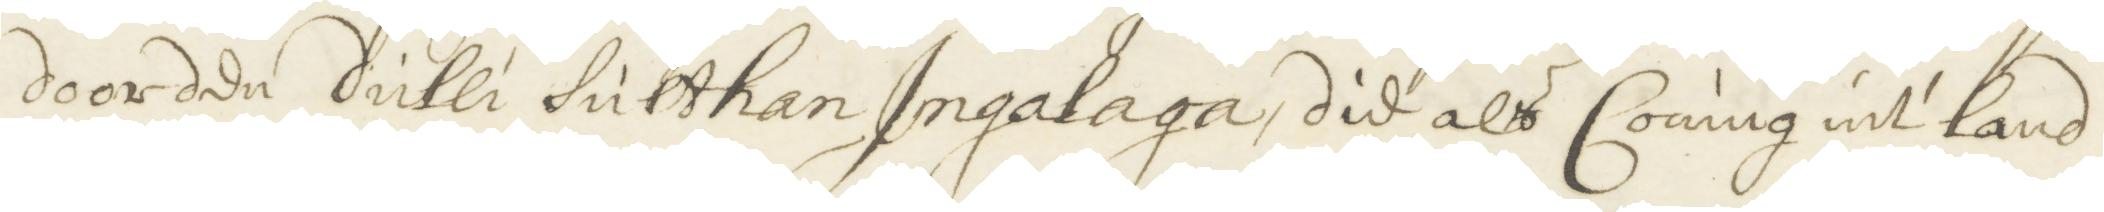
door den dulli sulthan Jngalaga, die als Coning int' land
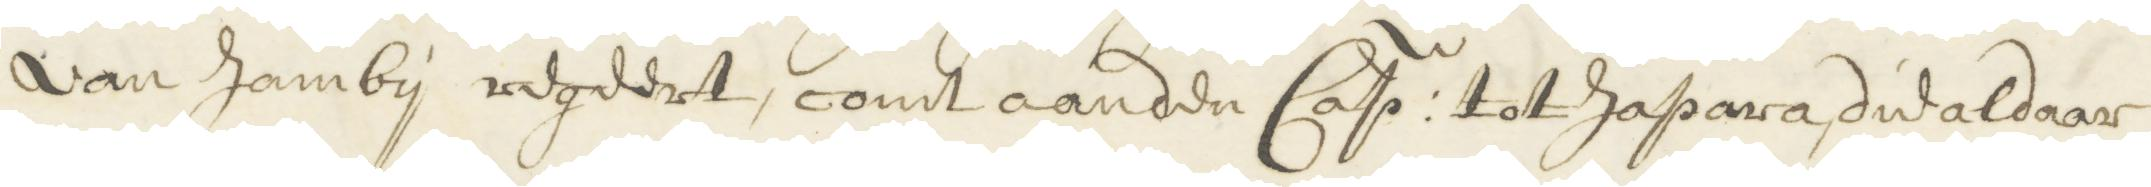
van Jambij regeert, comt aanden Cap:n tot Japara, die aldaar
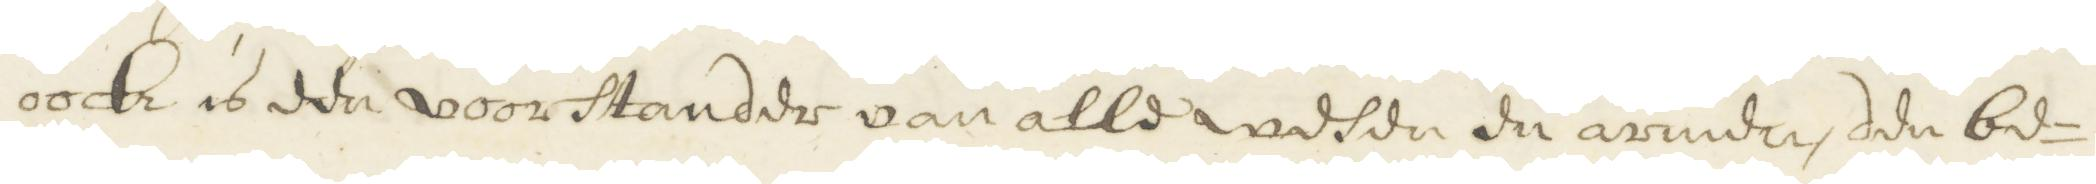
oock is een voorstander van alle wesen en armen, den be=
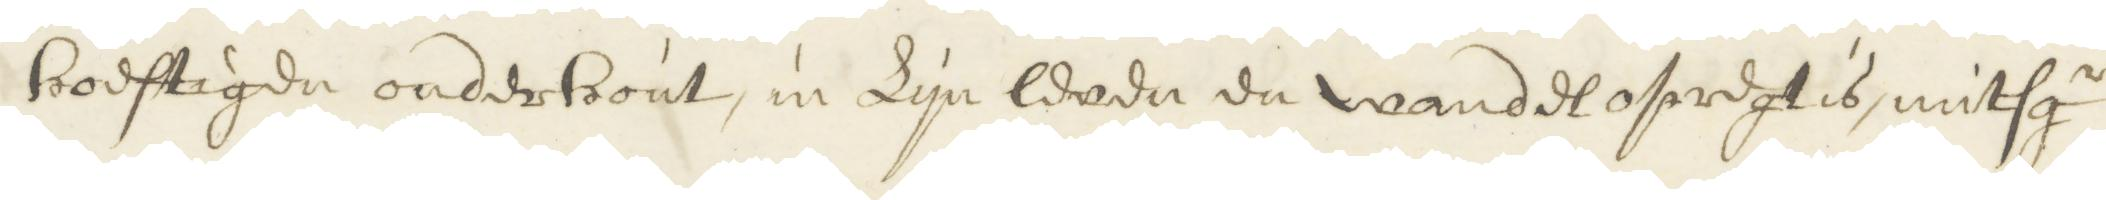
hoeftigen onderhout, in zijn leven en wandel opregt is, mitsg=r
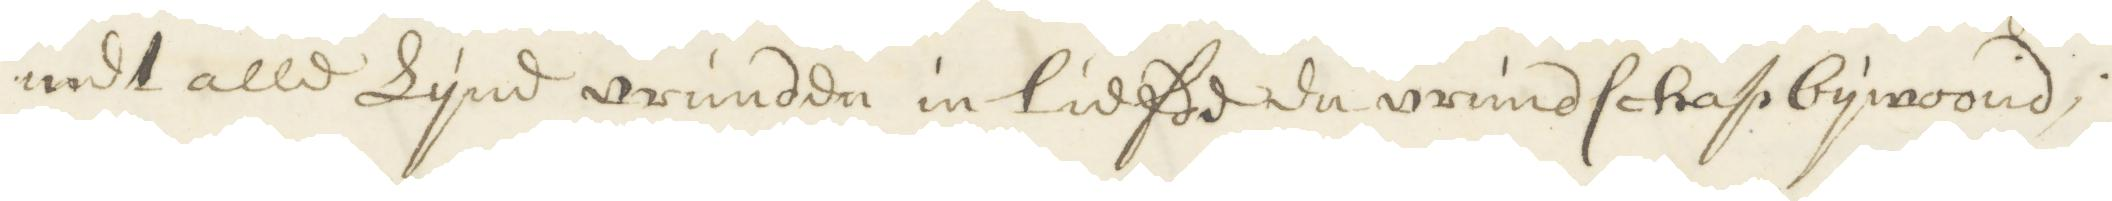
met alle zijne vrunden in liefde en vrundschap bijwoond,
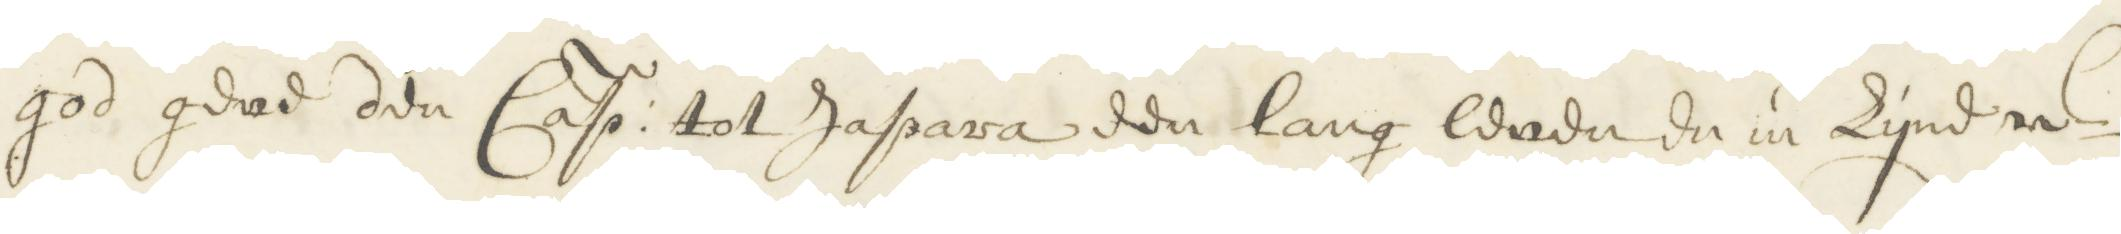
god geve den Cap:n tot Japara een lang leven en in zijne re=
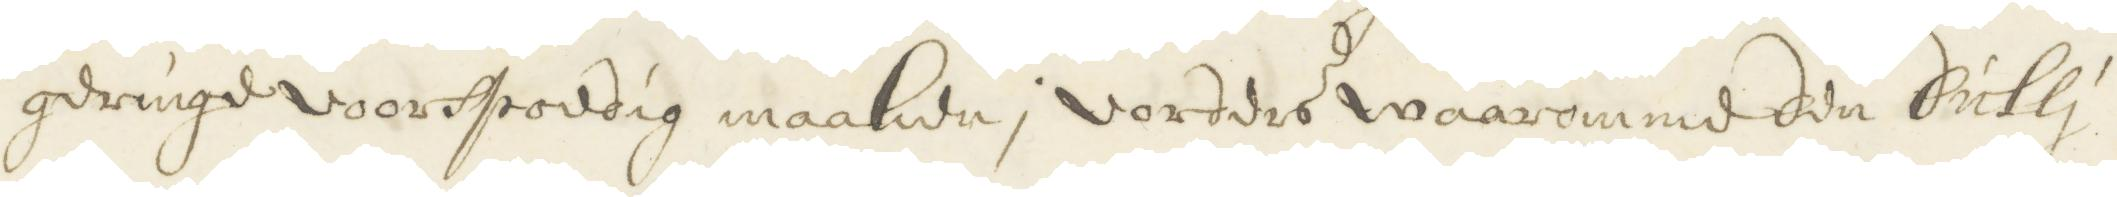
geringe voorspoedig maaken; vorders waaromme den dullj
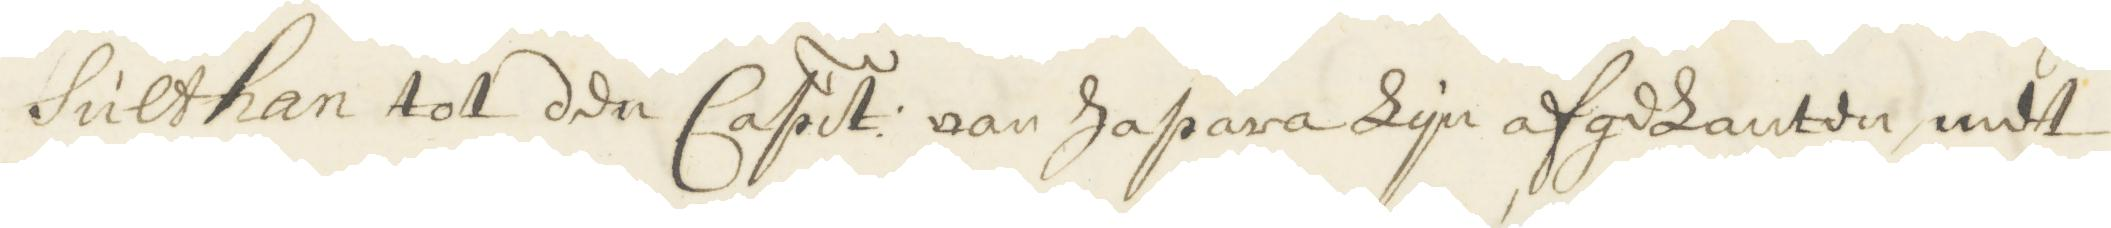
sulthan tot den Capit: van Japara zijn afgezanten, met
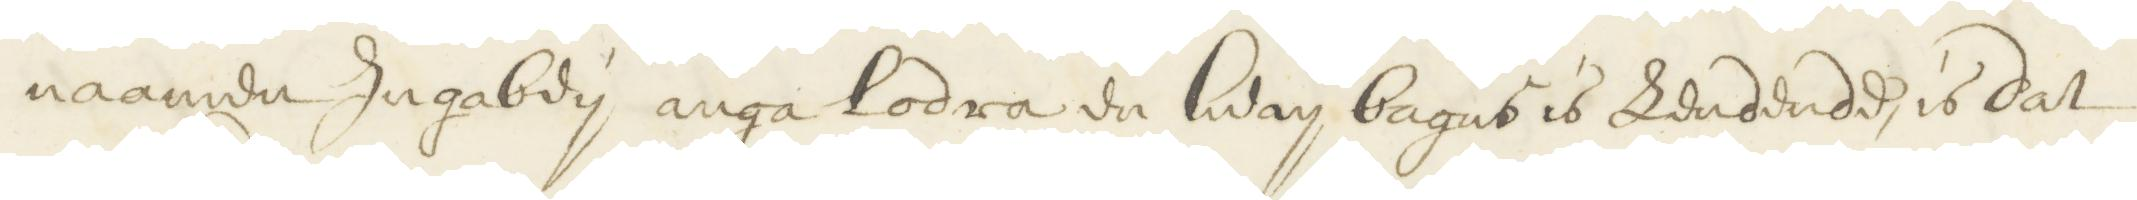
naamen Jngabeij angalodra en keaij bagus is zendende, is dat
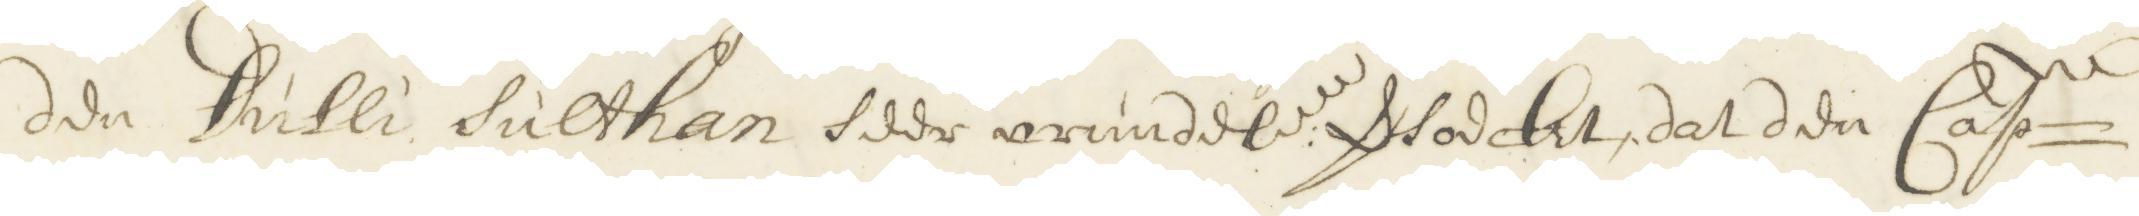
den Dulli sulthan seer vrundel: versoeckt, dat den Cap=n
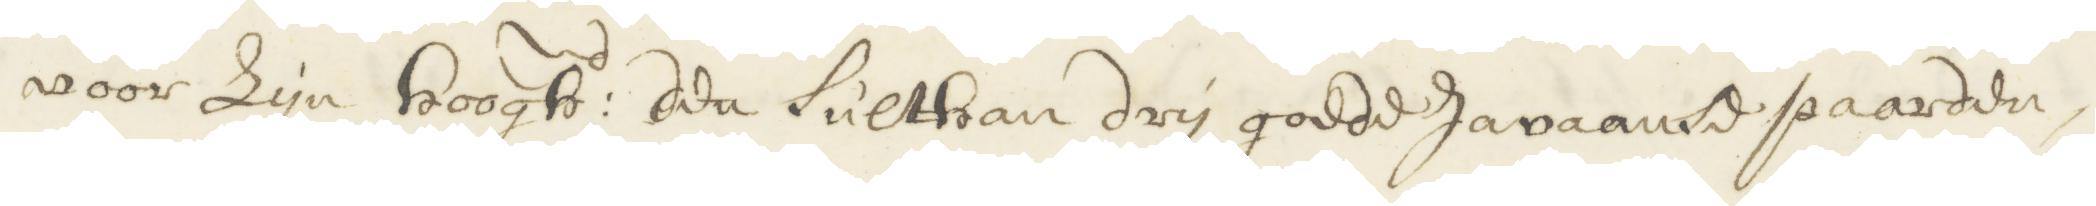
voor zijn hoogh:d den sulthan drij goede Javaanse paarden,
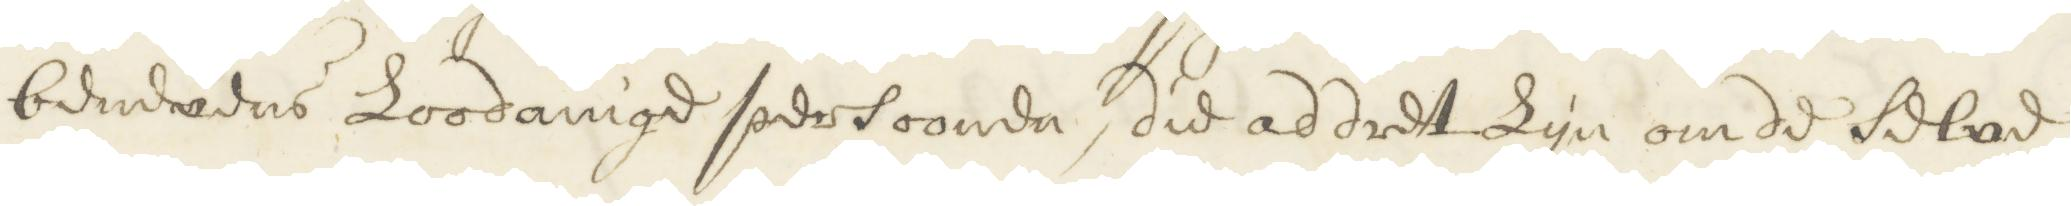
benevens zoodanige persoonen, die addret zijn om de selve
